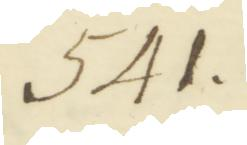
541.
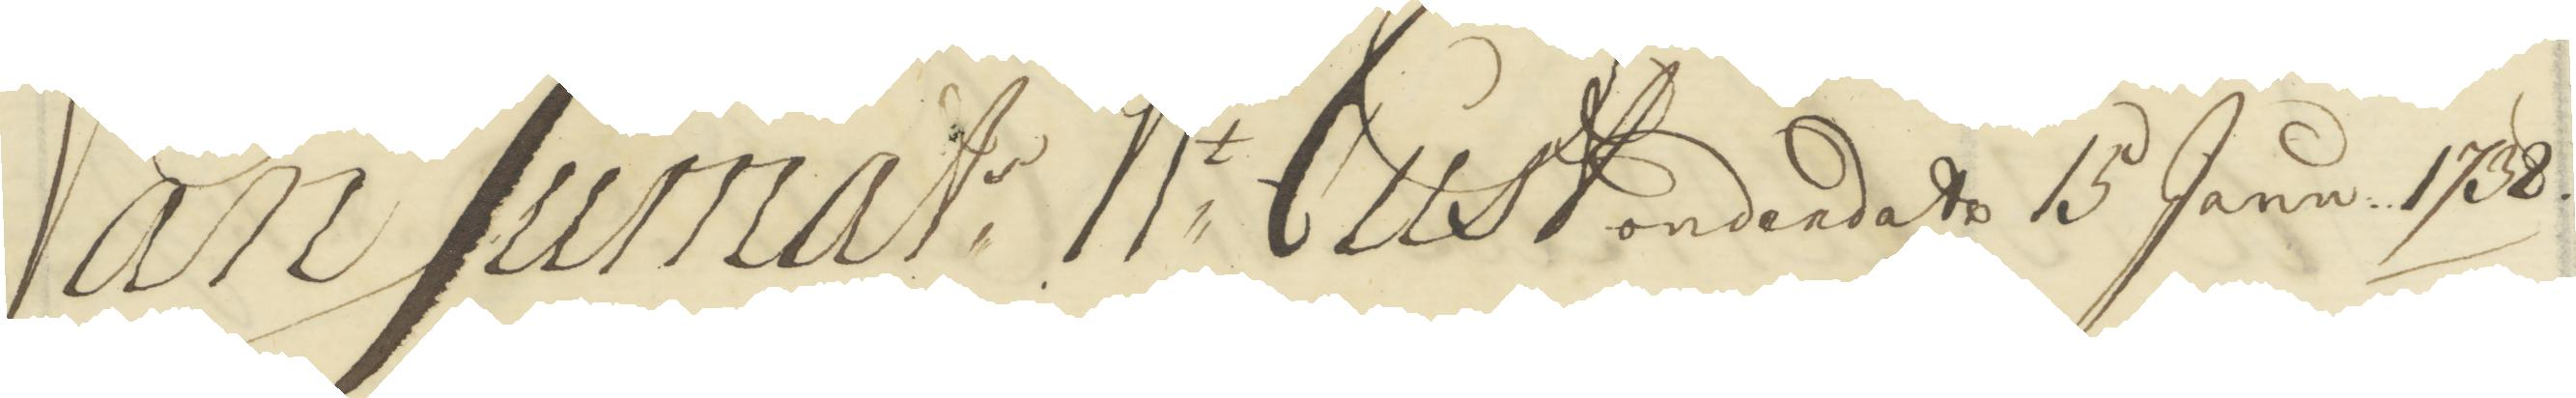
Van Sumat„s W„t Cust onderdato 15 Jann: 1738.
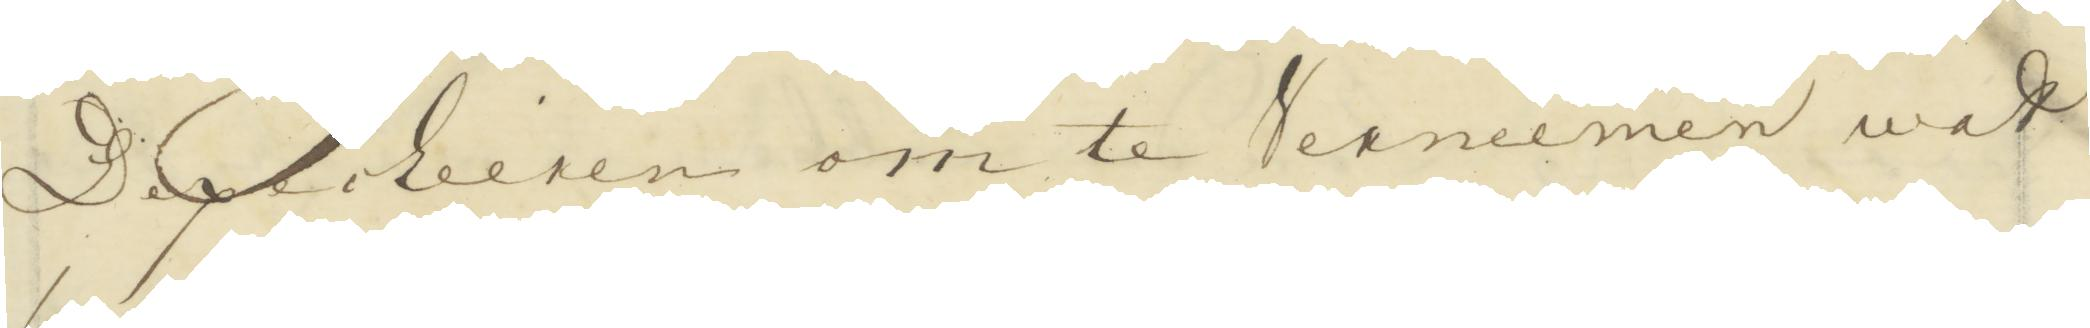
Depecheeren om te verneemen wat
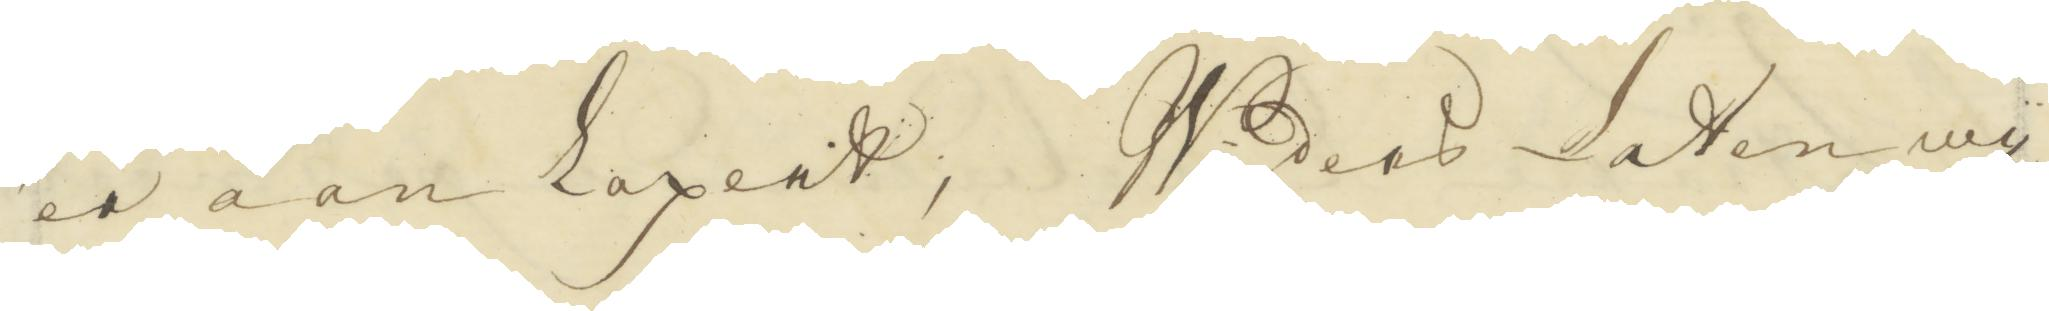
er aan hapert, Wijders Laten wij
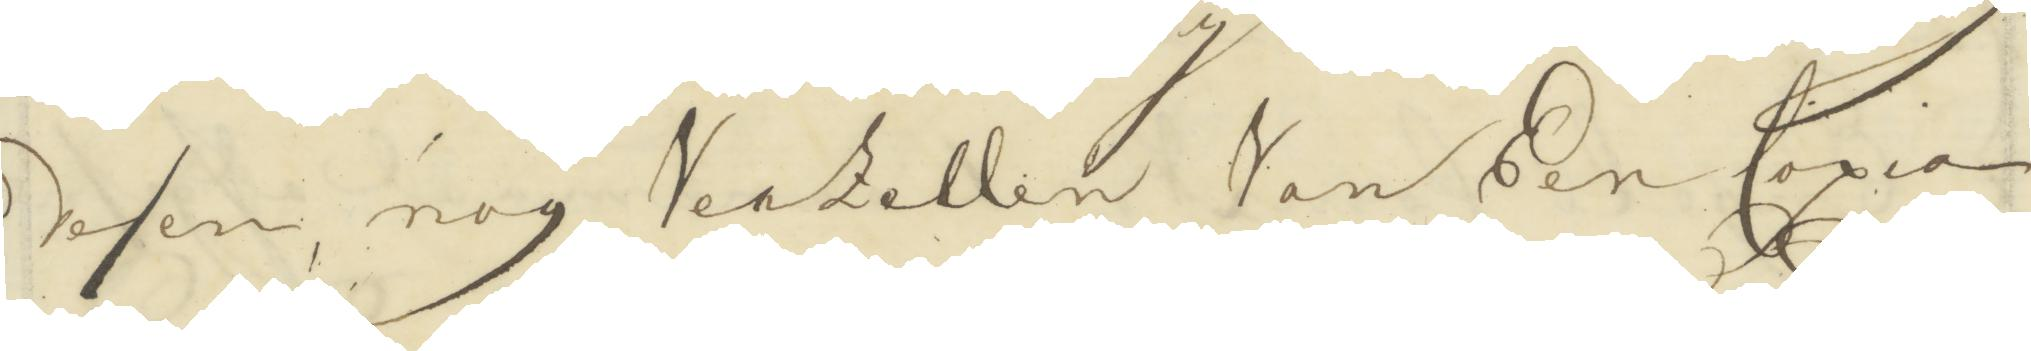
desen, nog verzellen van Een Copia
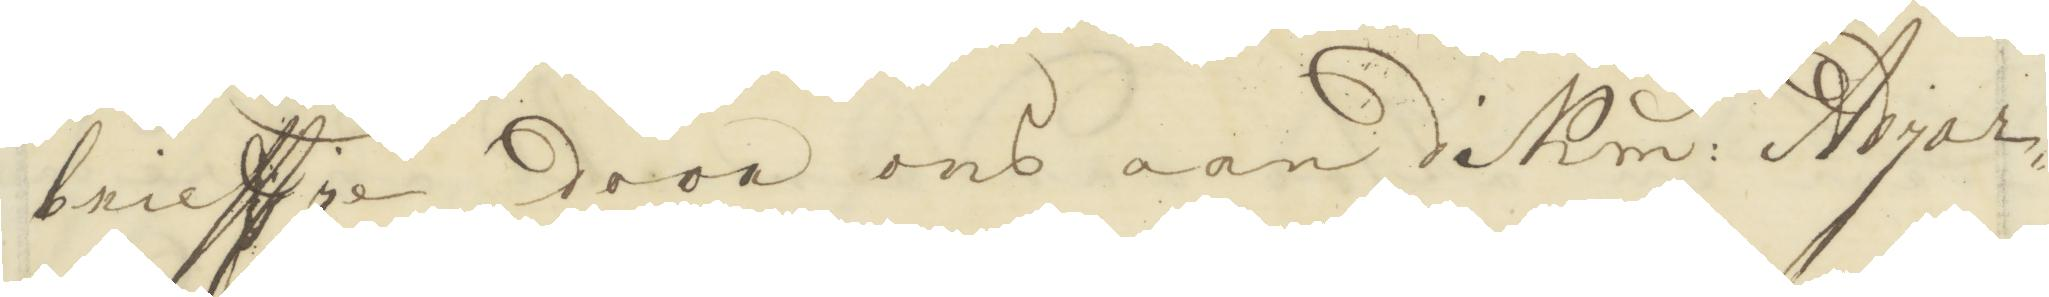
brieffje door ons aan d' Km: Adjar„
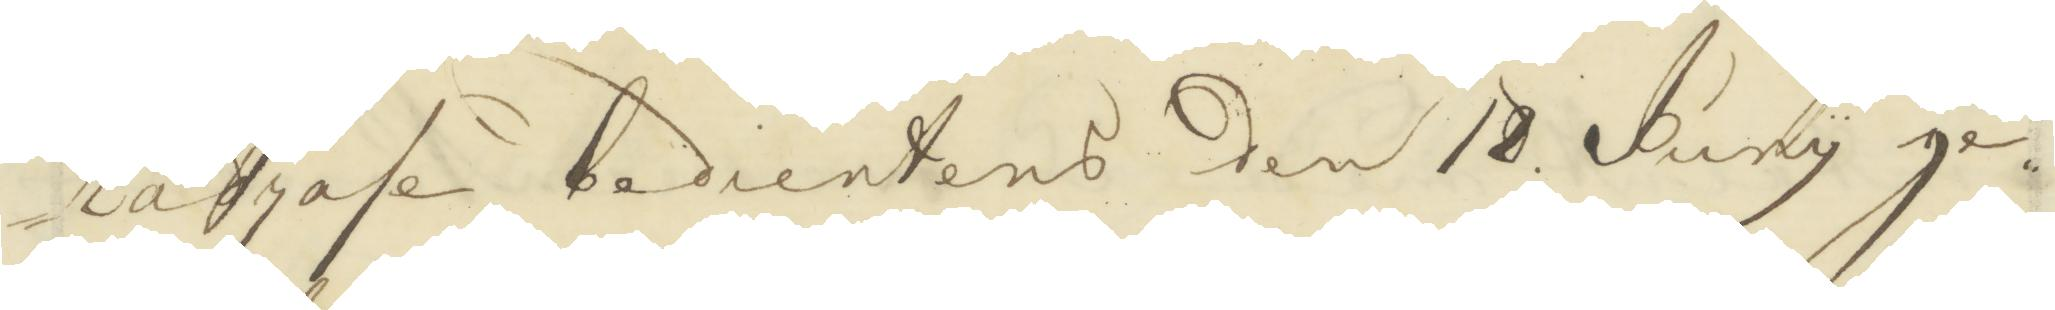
=hadjase bedientens den 18. Junij ge„
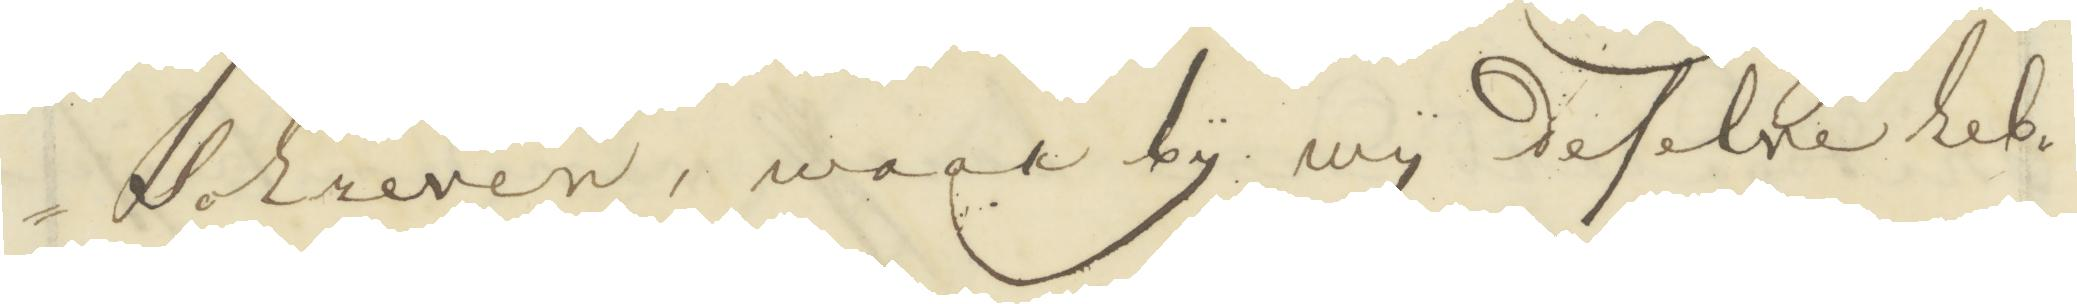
=schreven, waar bij wij deselve heb„
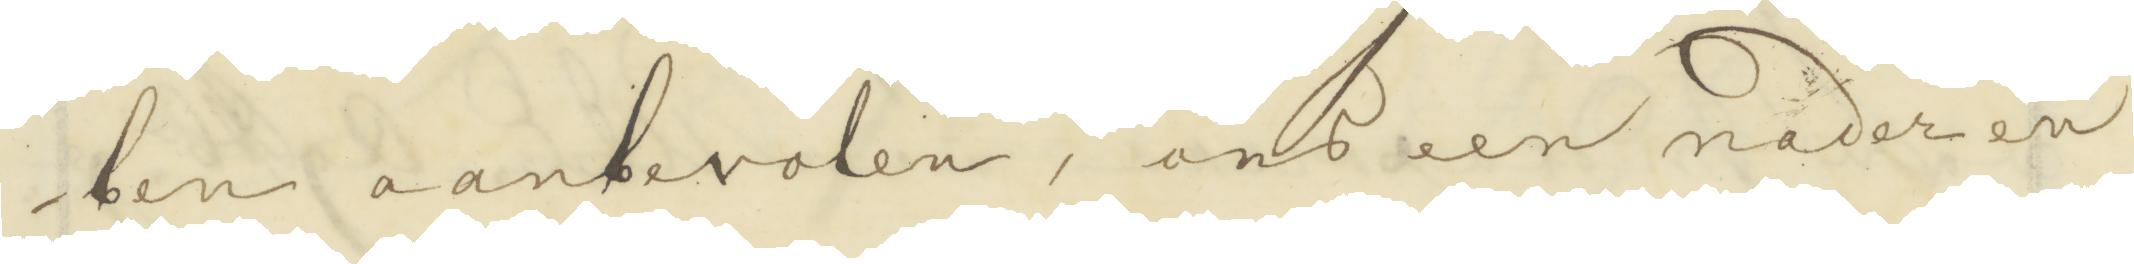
=ben aanbevolen, ons een nader en
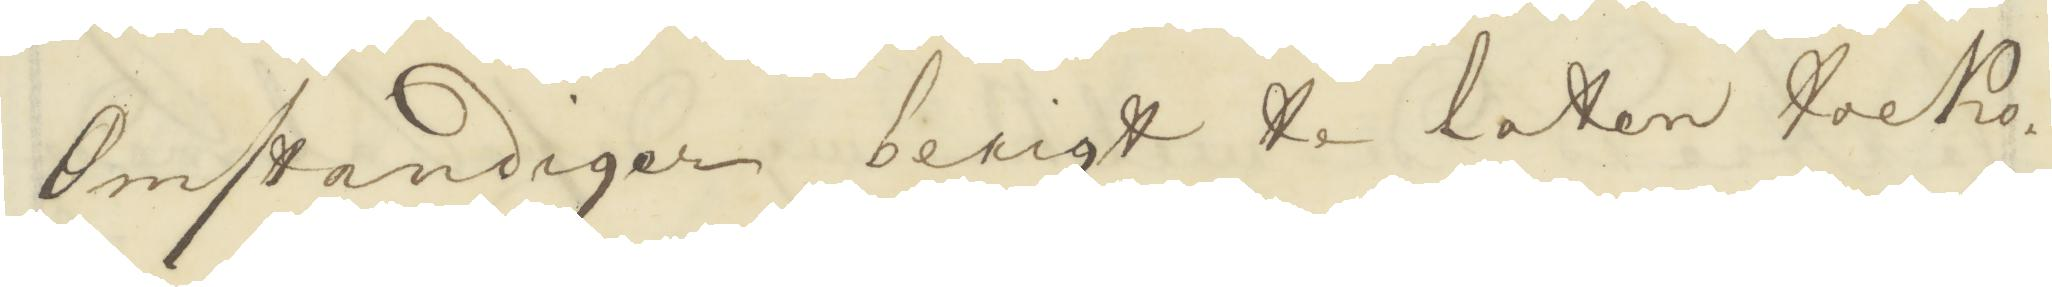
omstandiger berigt te laten toeko„
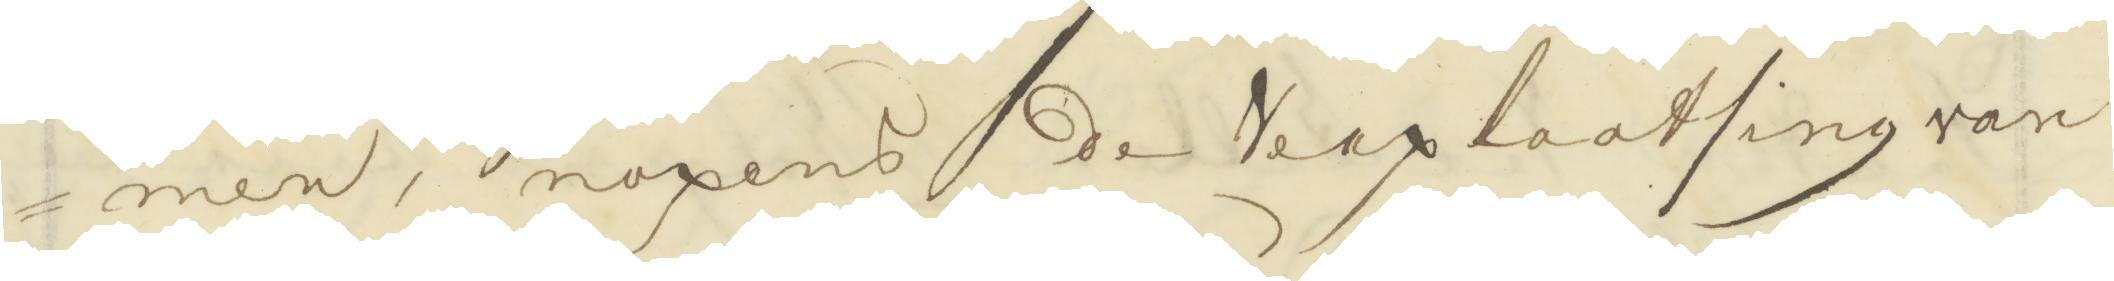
=men, nopens de verplaatsing van
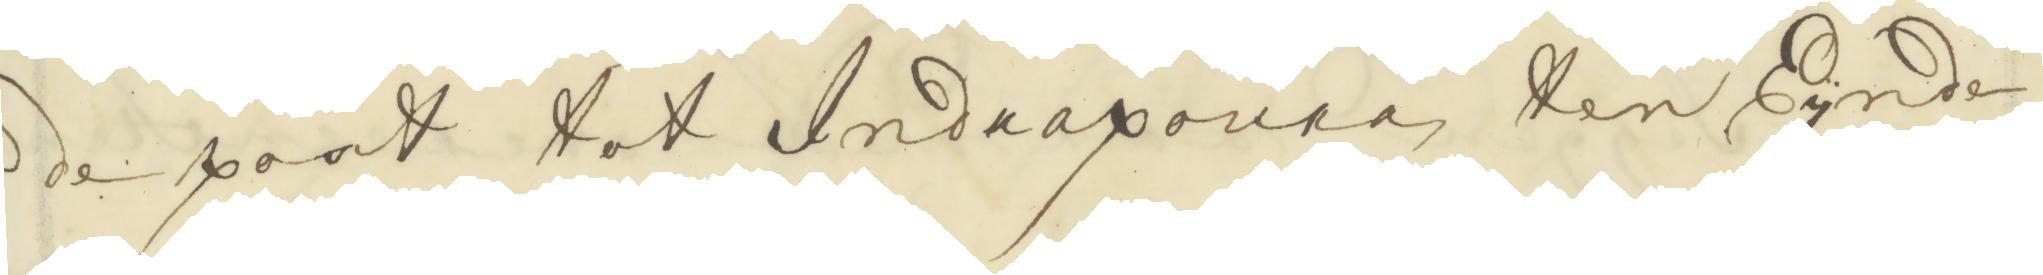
de post tot Jndrapoura den Eijnde
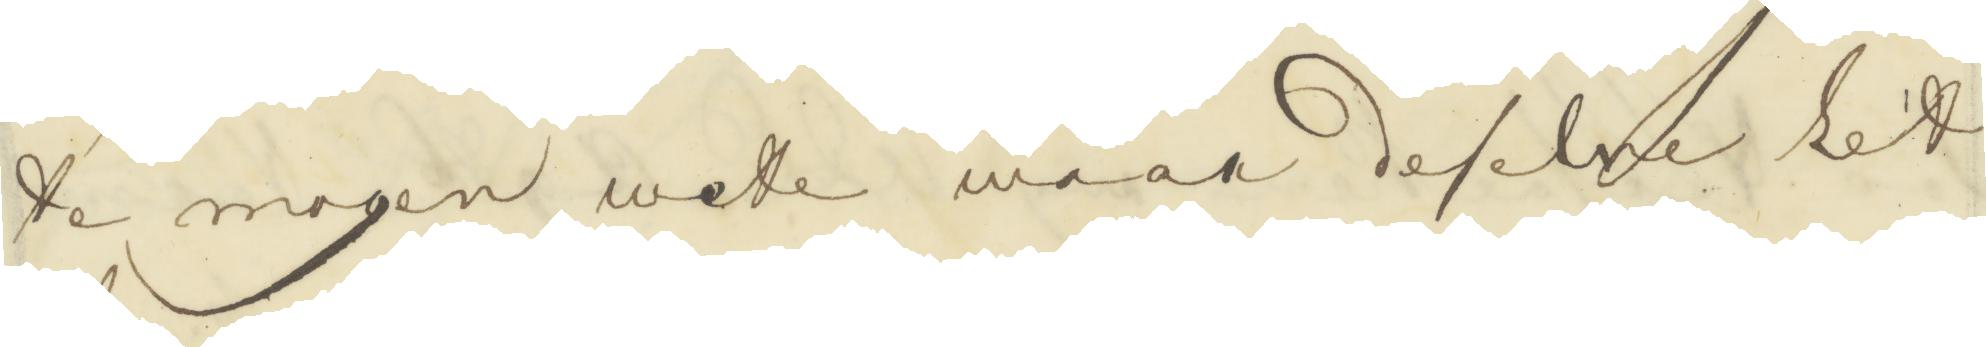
te mogen wete waar deselve het
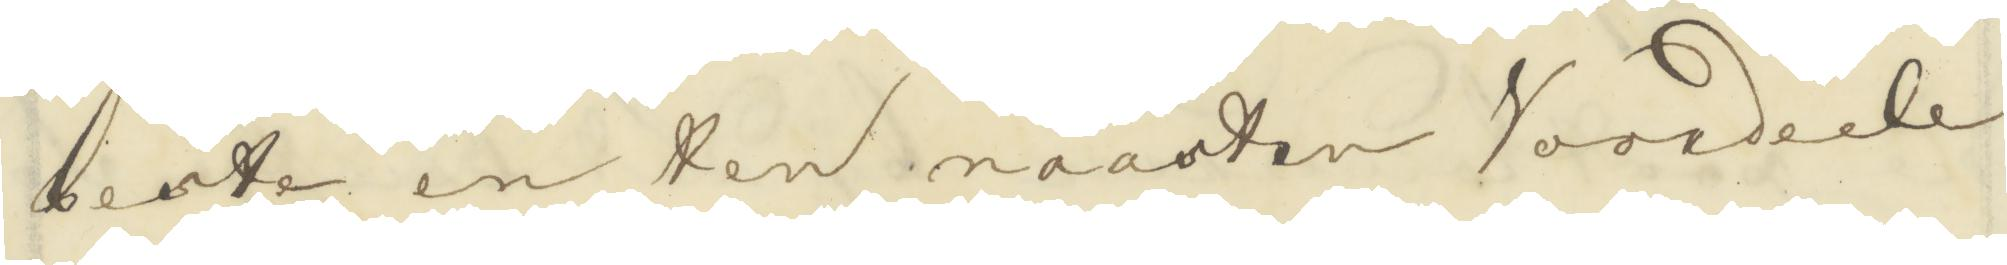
beste en ten naasten voordeele
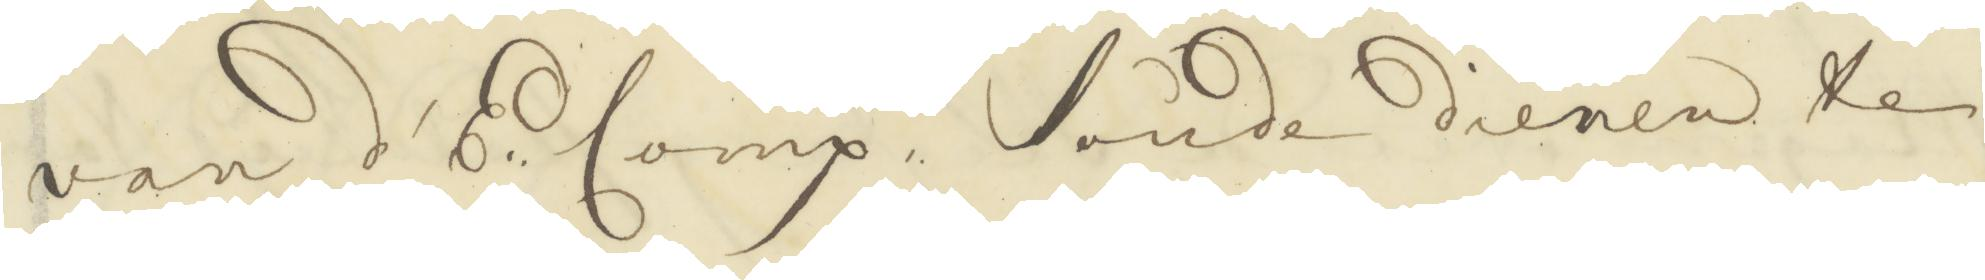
van d’ E: Comp„e soude dienen te
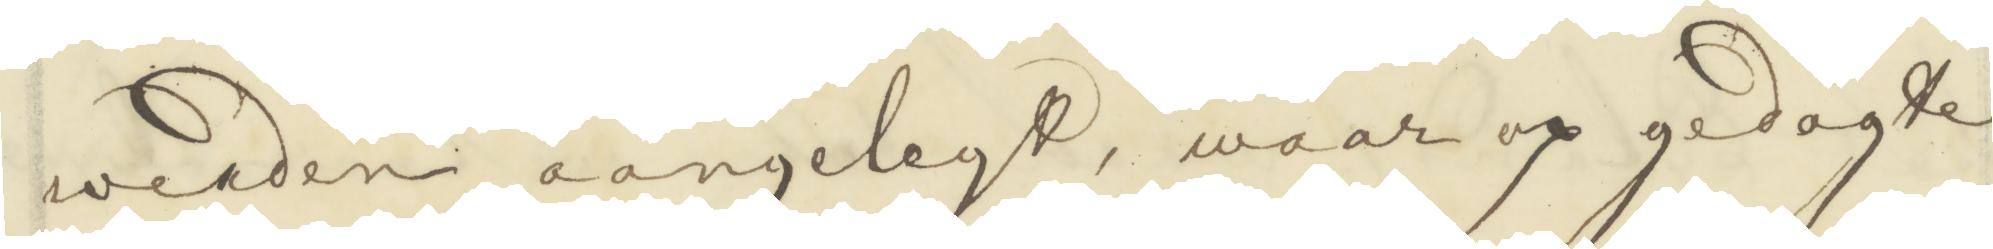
werden aangelegt, waar op gedagte
